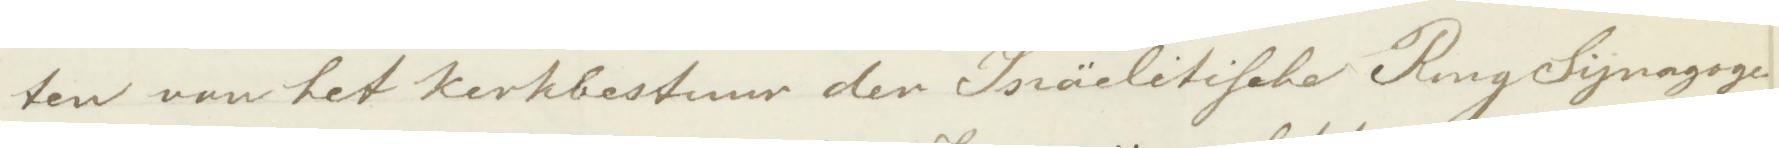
ten van het kerkbestuur der Israëlitische Ring Sijnagoge
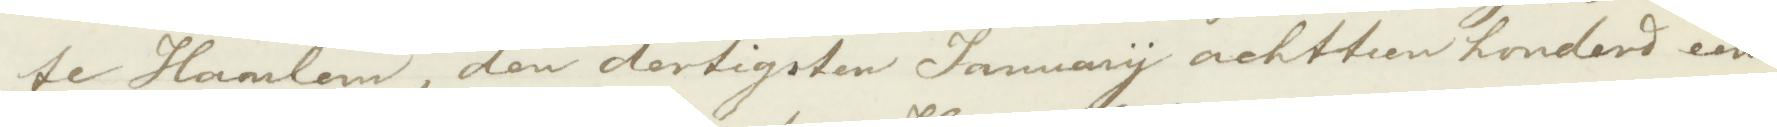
te Haarlem, den dertigsten Ianuarij achttien honderd een
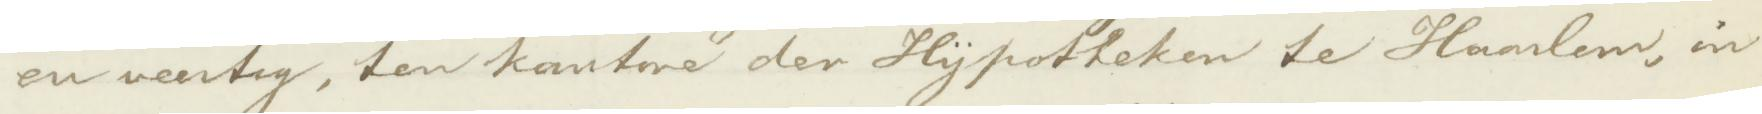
en veertig, ten kantore der Hijpotheken te Haarlem, in
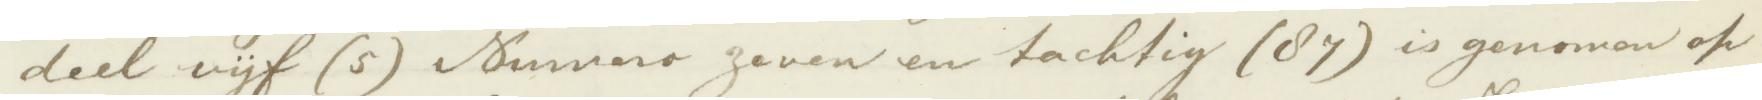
deel vijf (5) Numero zeven en tachtig (87) is genomen op
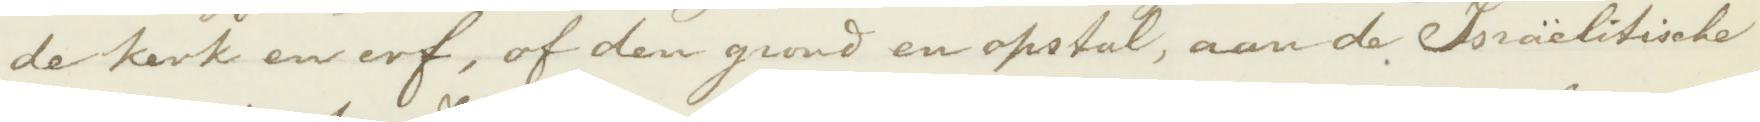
de kerk en erf, of den grond en opstal, aan de Israëlitische
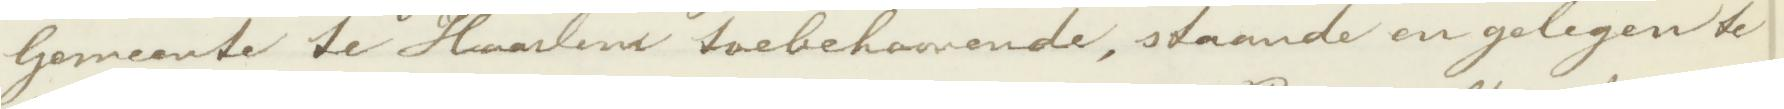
Gemeente te Haarlem toebehoorende, staande en gelegen te
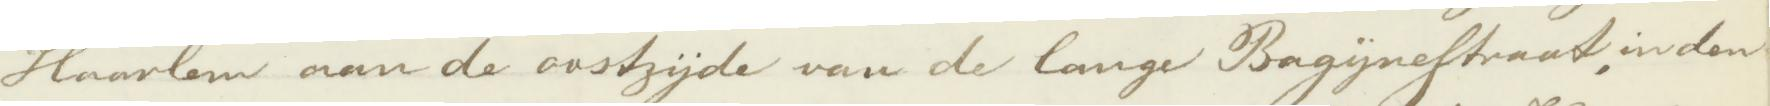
Haarlem aan de oostzijde van de lange Bagijnestraat, in den
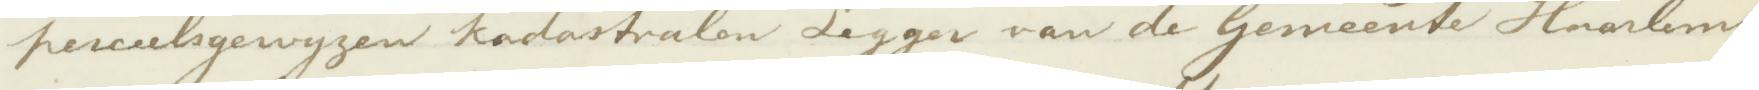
perceels gewijzen kadastralen Legger van de Gemeente Haarlem
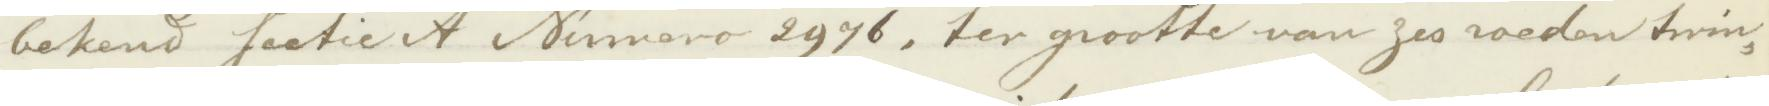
bekend sectie A Numero 2976, ter grootte van zes roeden twin„
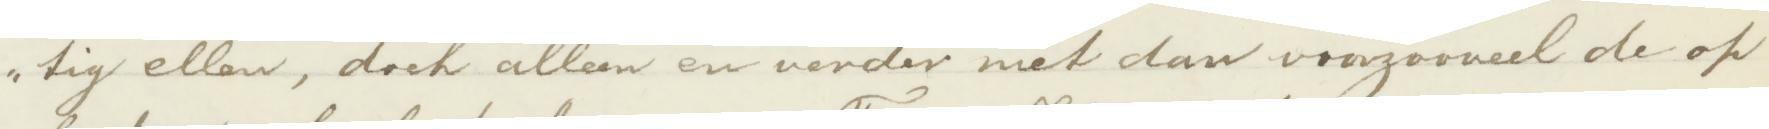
„tig ellen, doch alleen en verder niet dan voorzooveel de op
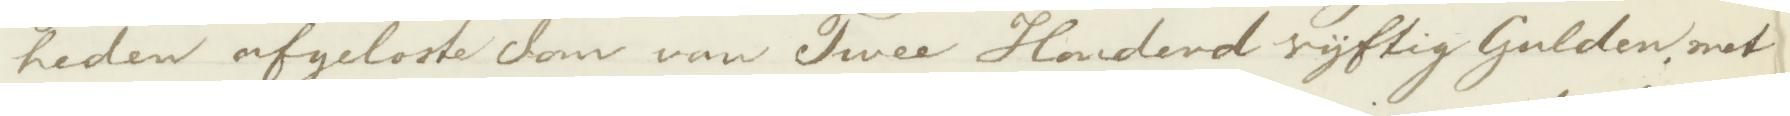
heden afgeloste som van Twee Honderd vijftig Gulden, met
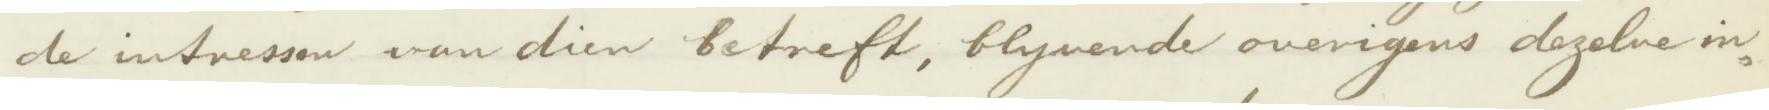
de intressen van dien betreft, blyvende overigens dezelve in„
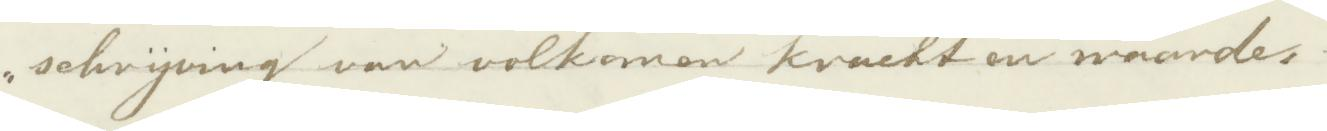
schrijving van volkomen kracht en waarde,
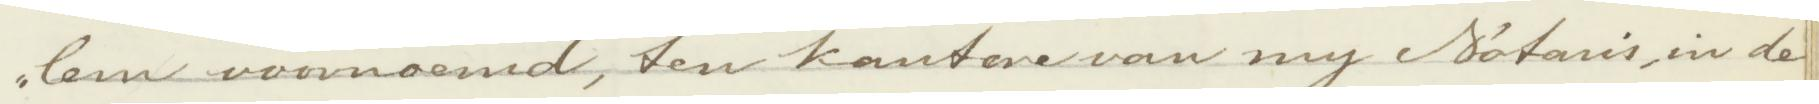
„lem voornoemd, ten kantore van mij Notaris, in de
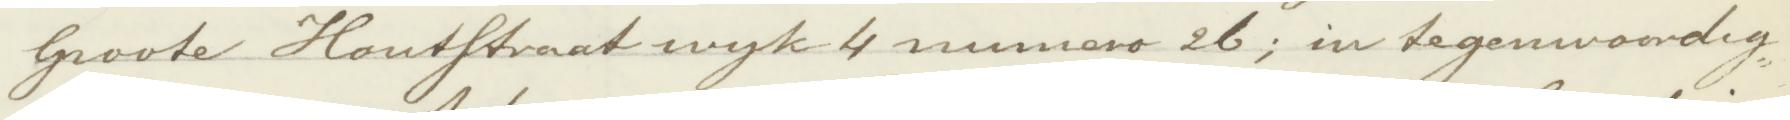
Groote Houtstraat wyk 4 numero 26; in tegenwoordig„
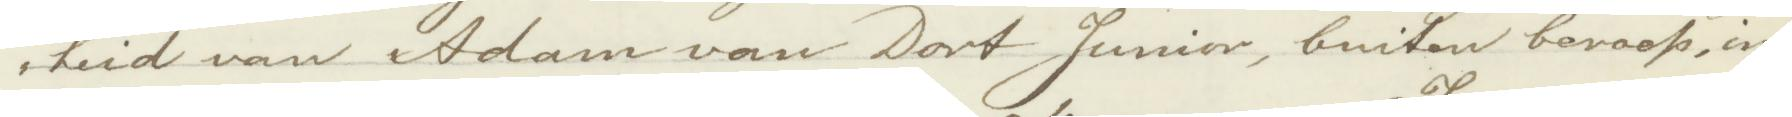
„heid van Adam van Dort Junior, buiten beroep, in
